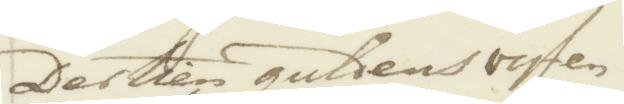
Dertien guldens vyf en
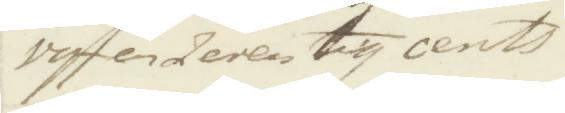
vyf en Zeventig cents
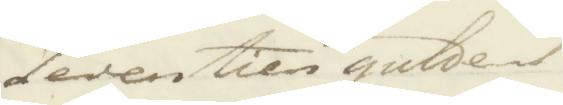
Zeventien gulden
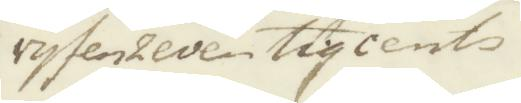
vyfen zeventig cents
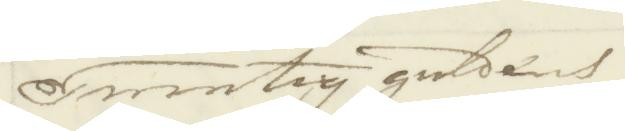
Twintig guldens
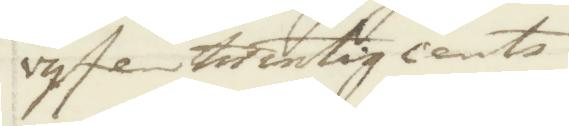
vyf en twintig cents
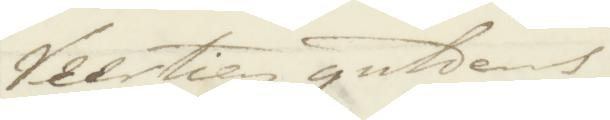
Veertien guldens
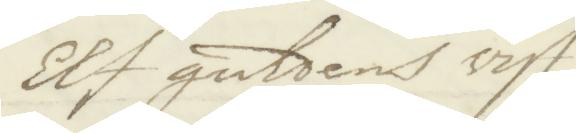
Elf guldens vyf
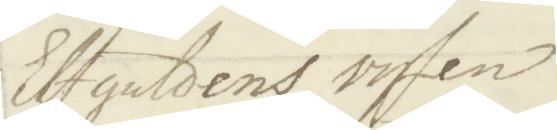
Elf guldens vyfen
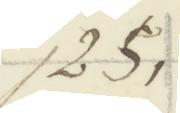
25,
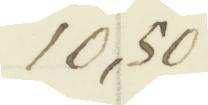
10,50
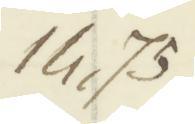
14,75
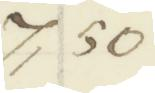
7, 50
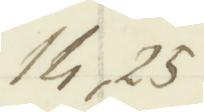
14,25
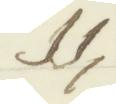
11,
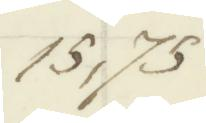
15, 75
